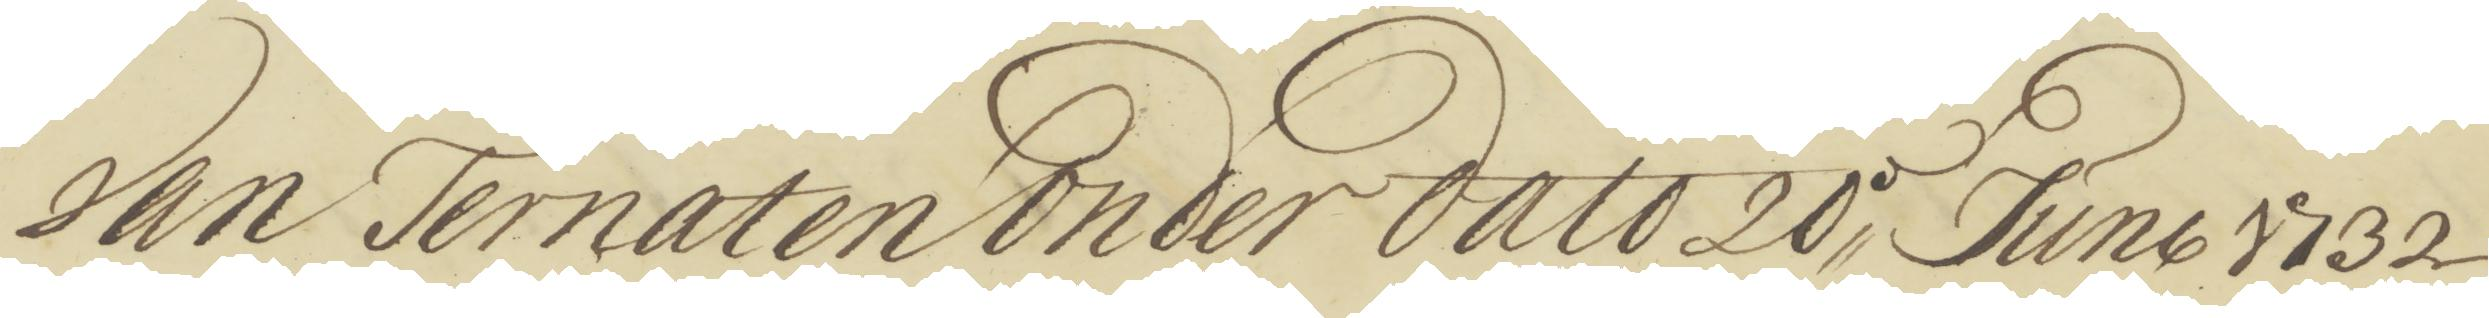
Van Ternaten onder dato 20„e Iuni 1732
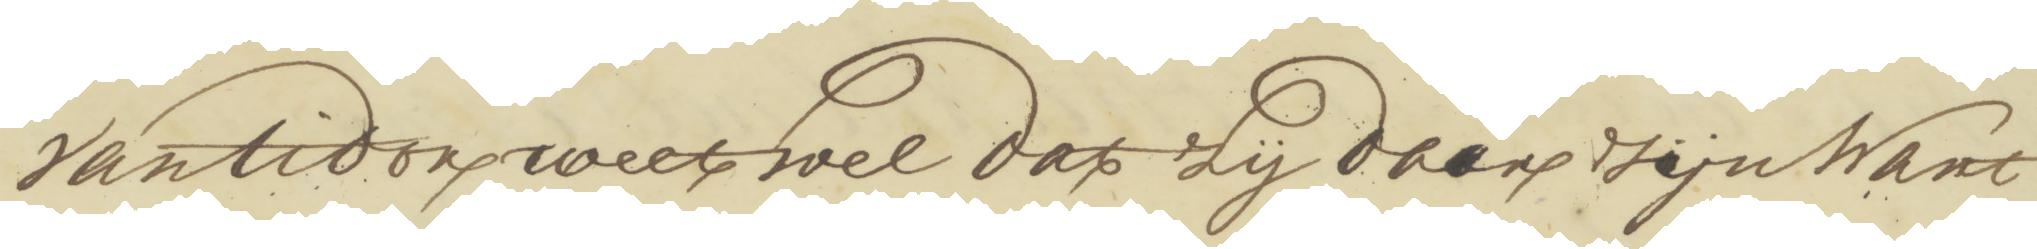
van tidor weet wel dat zij daar zijn want
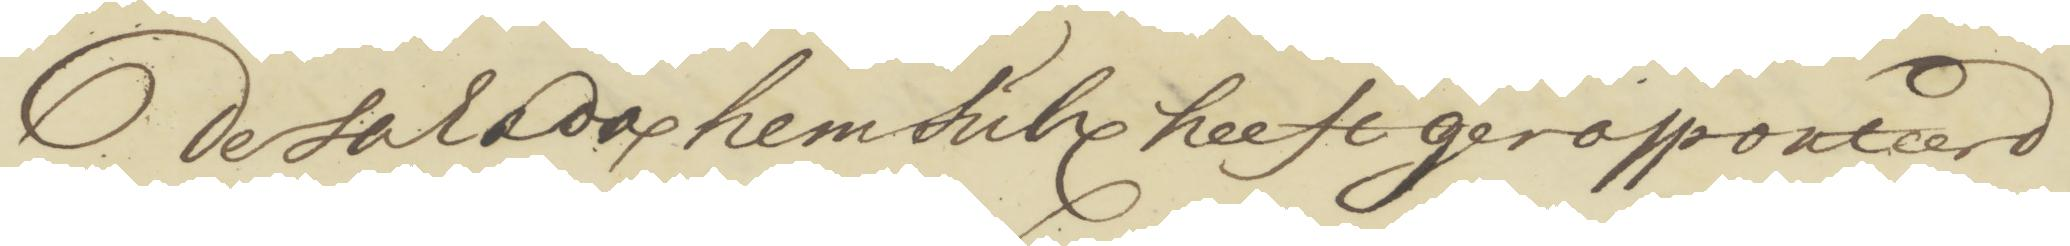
de sahado hem sulx heeft gerapporteerd
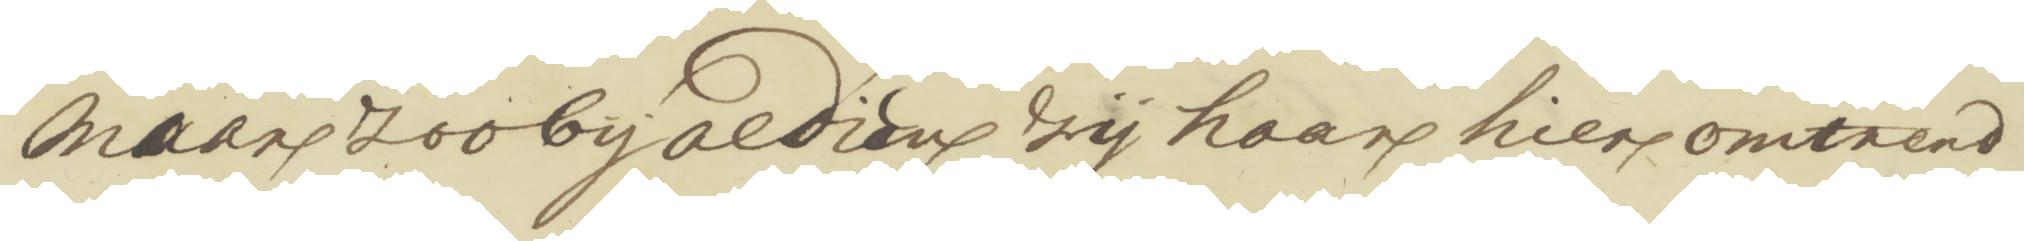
maar zoo bij aldien zij haar hier omtrend
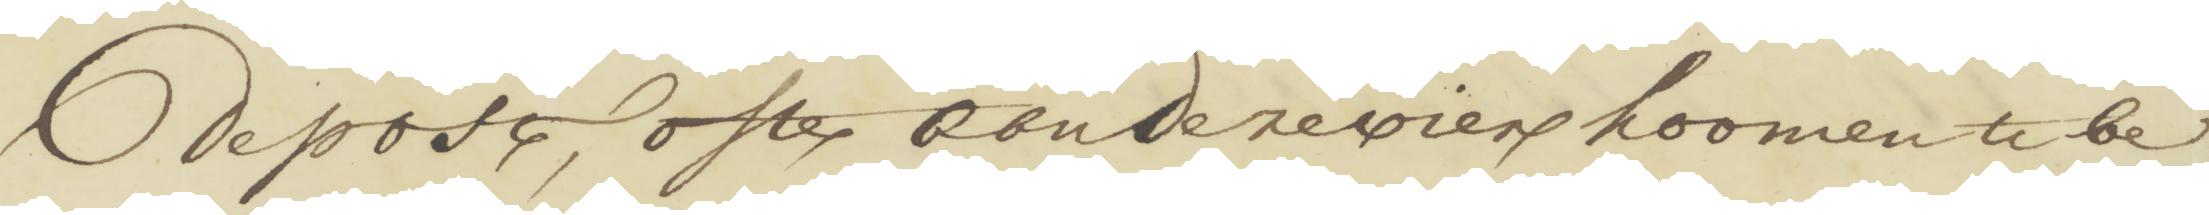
de post, ofte aan de revier koomen te be
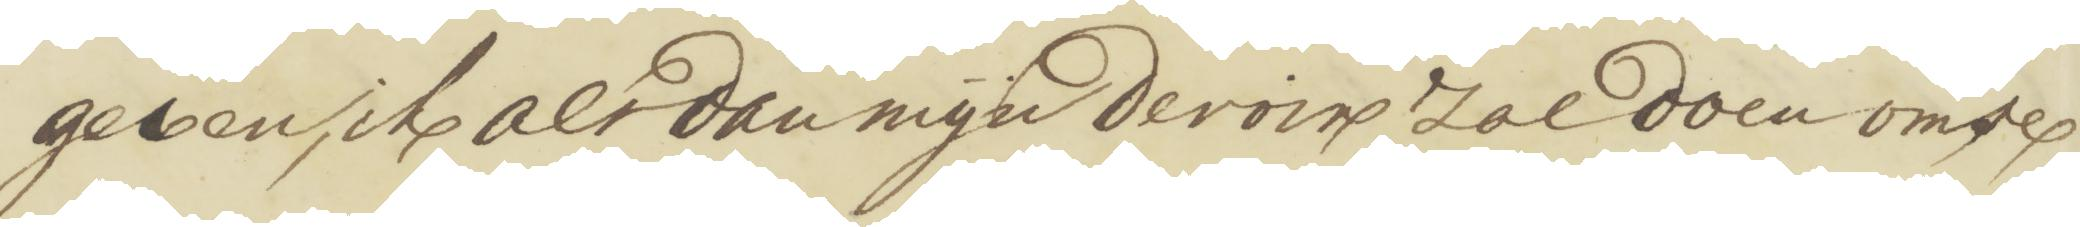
geven, ik als dan mijn devoir zal doen omse
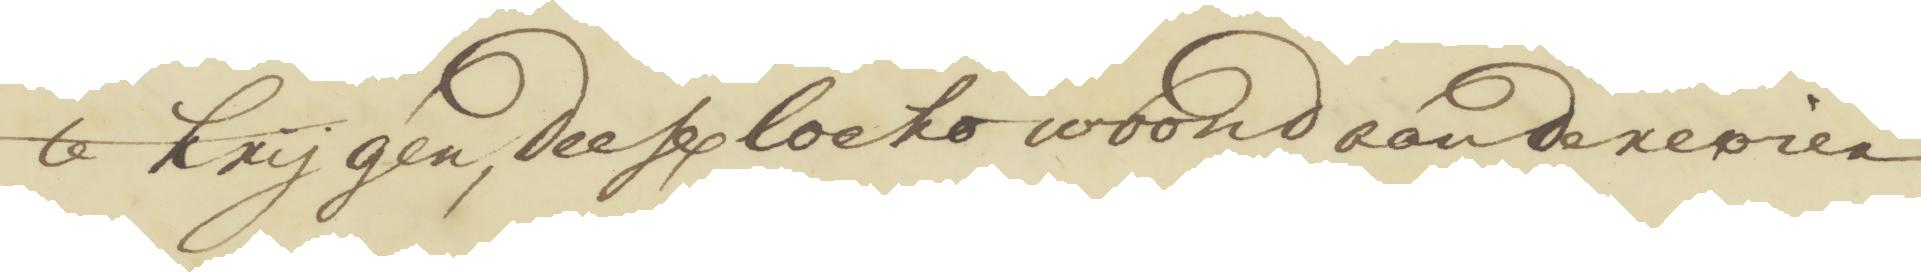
te krijgen, deese loeko woond aan de revier
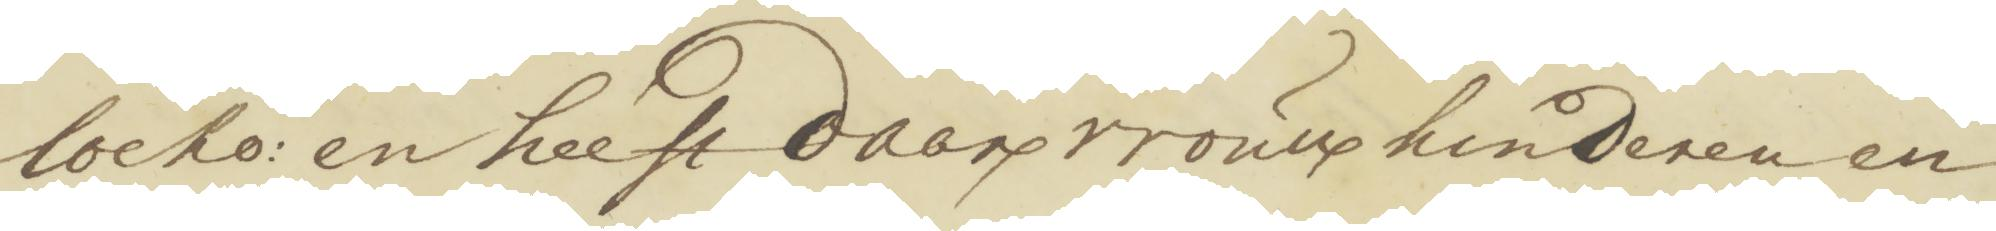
loeko: en heeft daar vrouw kinderen en
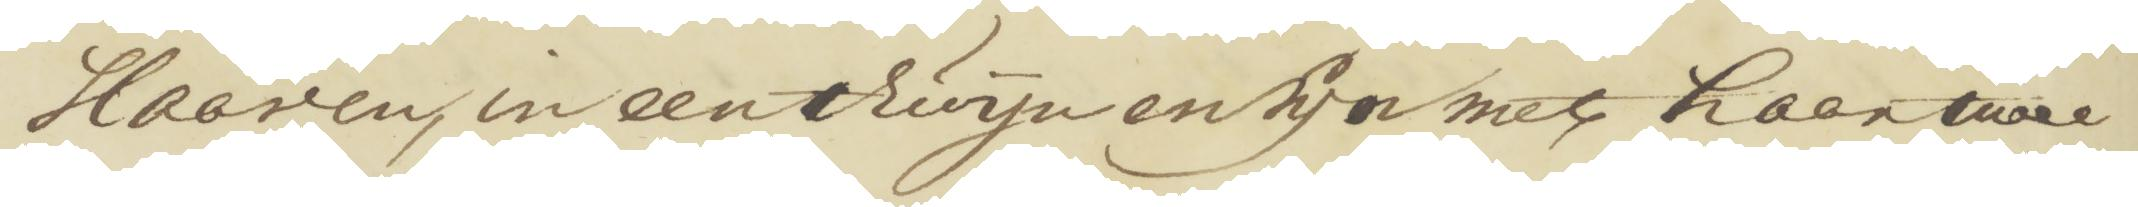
Slaaven, in een thuijn en syn met haar twee
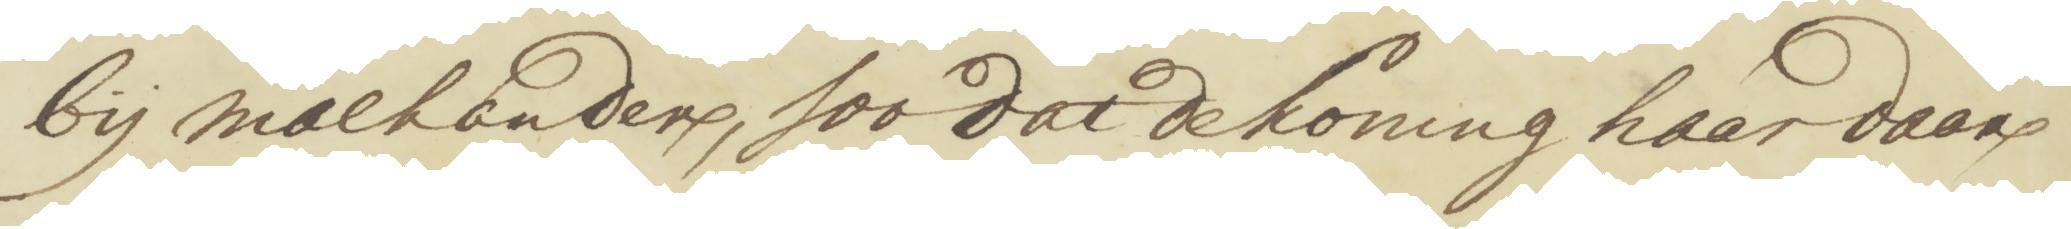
bij malkander, soo dat de koning haar daar
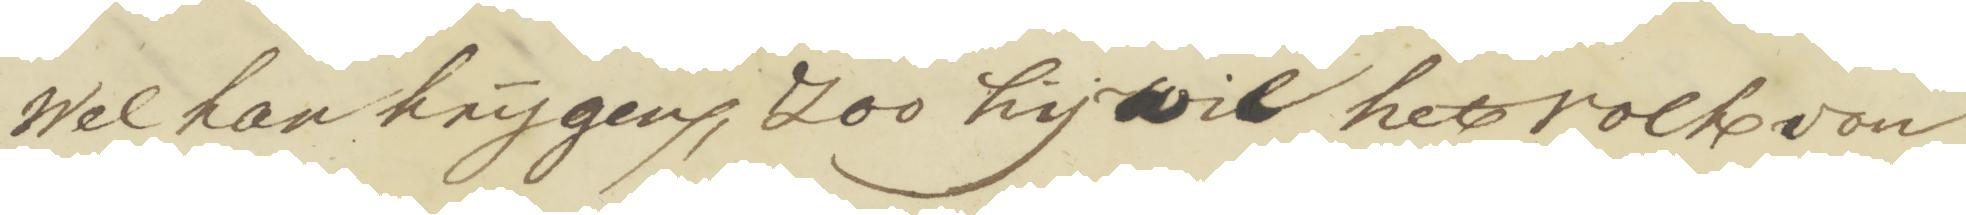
wel kan krijgen, zoo hij wil het volk van
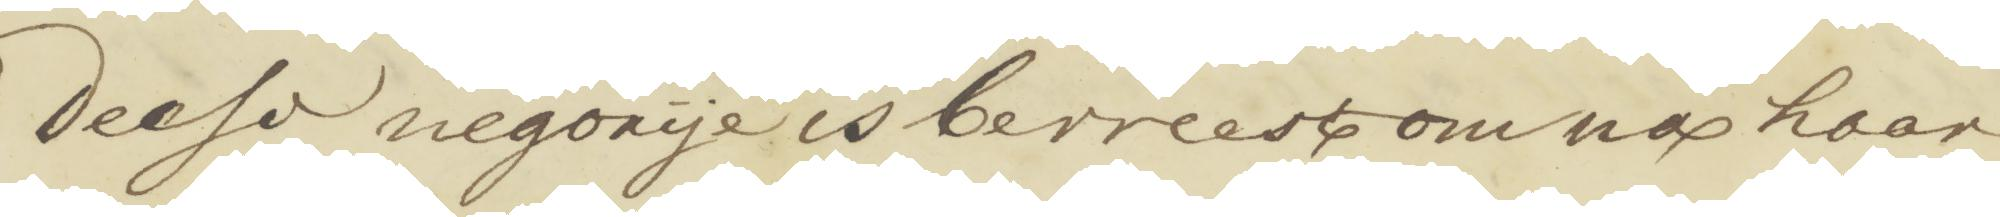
deese negorije is bevreest om na haar
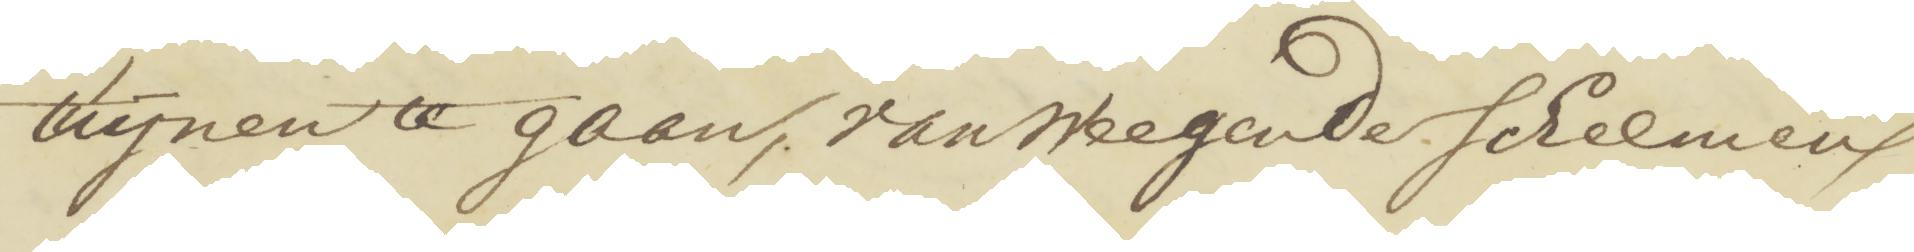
tuijnen te gaan, van weegende schelmen
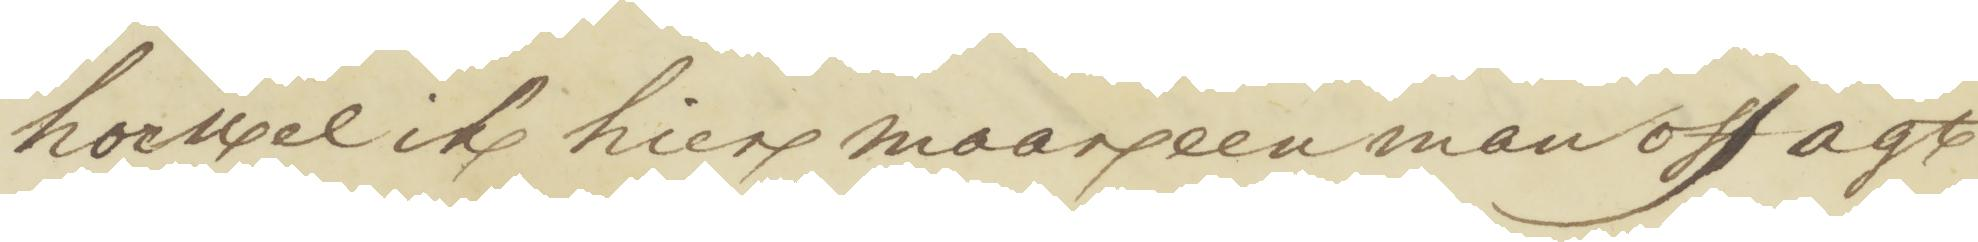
hoewel ik hier maar een man off agt
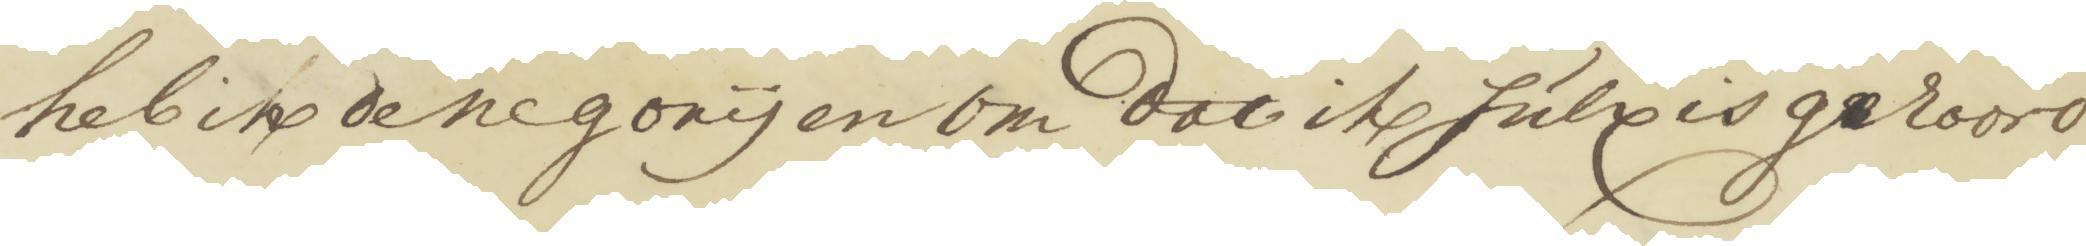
heb ik de negorij en om dat ik sulx is gehoord
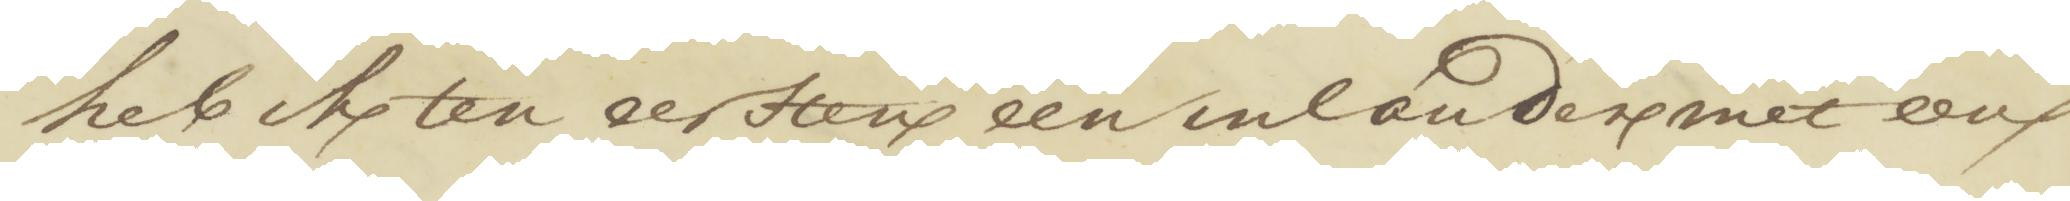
heb ik ten eersten een inlander met een
